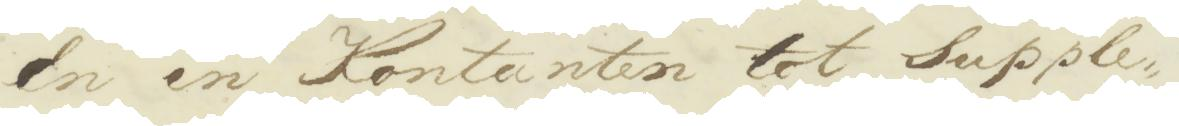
En in Kontanten tot supple„
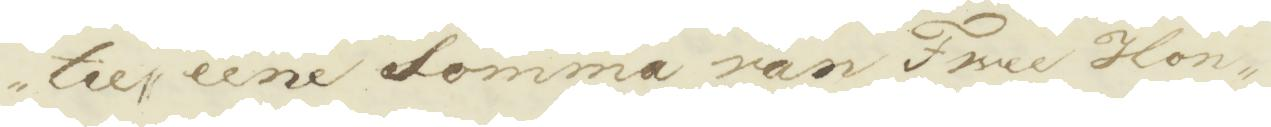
„tie, eene Somma van Twee Hon„
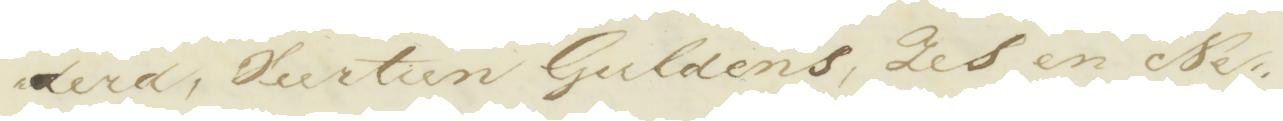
derd, Veertien Guldens, Zes en Ne„
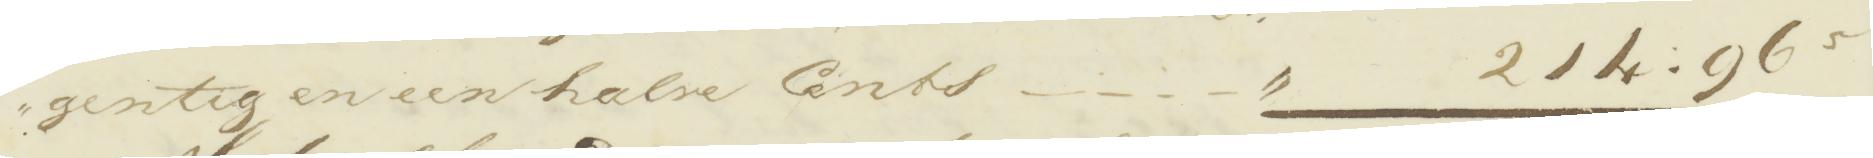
„gentig en een halve Cents - - - - „ 214: 96 5
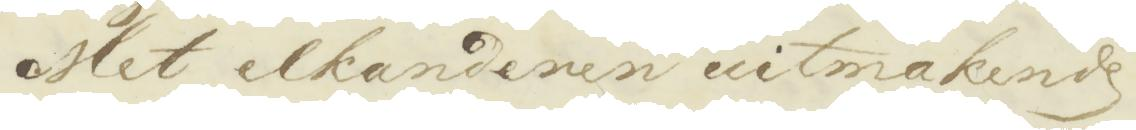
Met elkanderen uitmakende
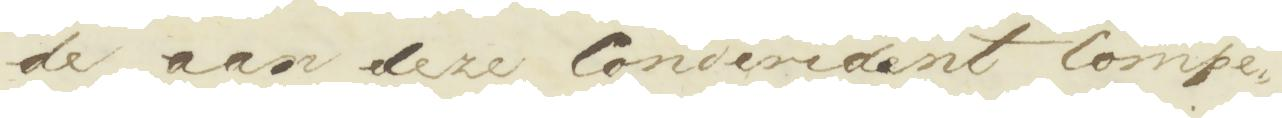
de aan deze Condivident Compe„
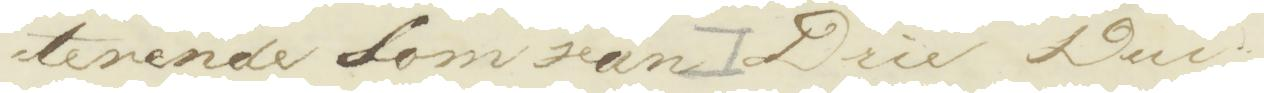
terende Som van] Drie Dui
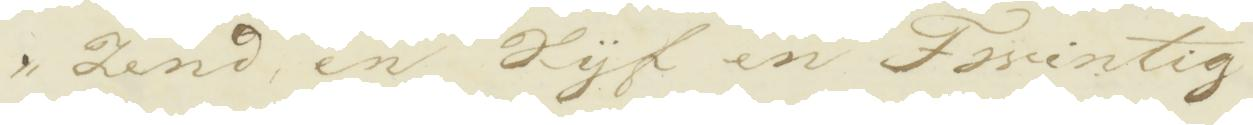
„ zend, en Vijf en Twintig
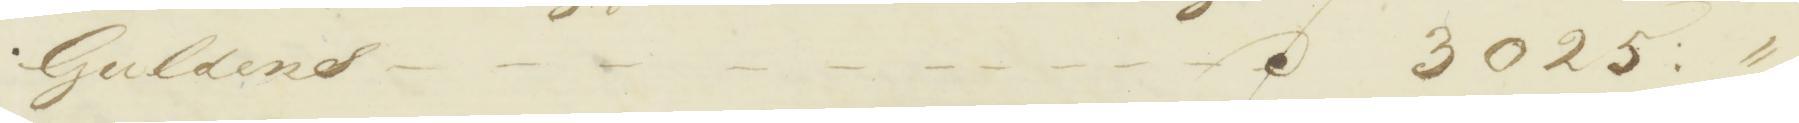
Guldens - - - - - - - - - - ƒ 3025: „
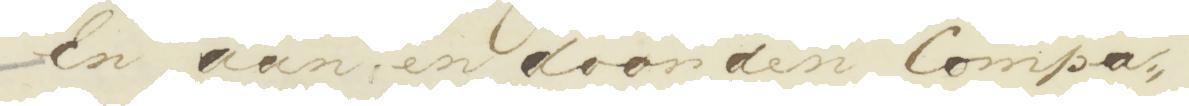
En aan, en door den Compa„
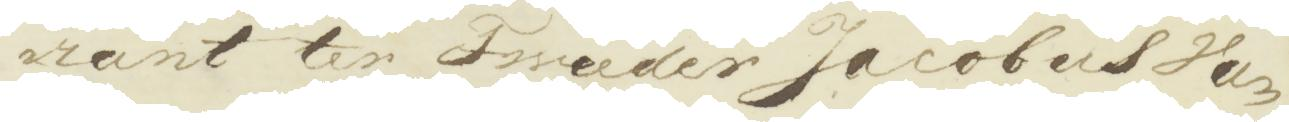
rant ter Tweeder Jacobus Van
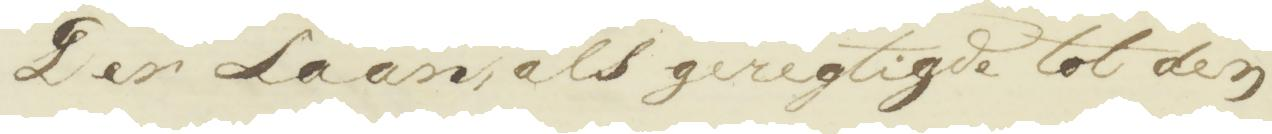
Der Laan, als geregtigde tot den
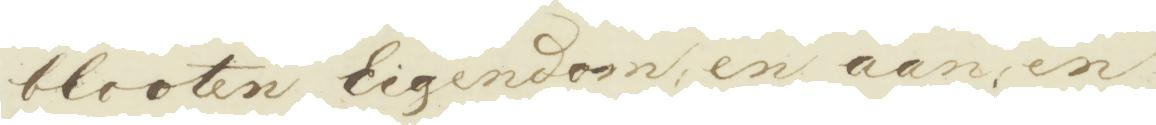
blooten Eigendom, en aan, en
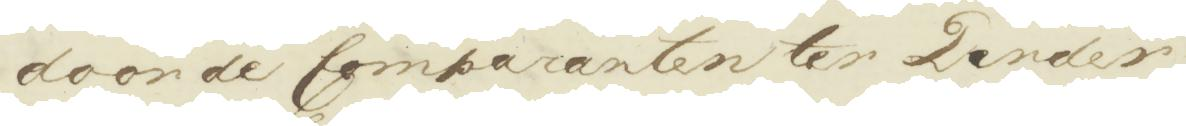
door de Comparanten ter Derder
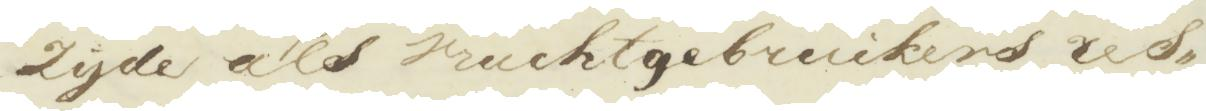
zijde als vruchtgebruikers res„
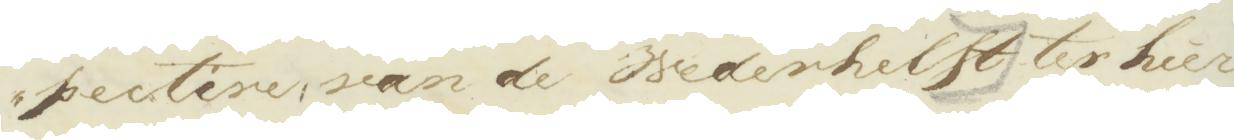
„pective, van de wederhelft] ter hier
